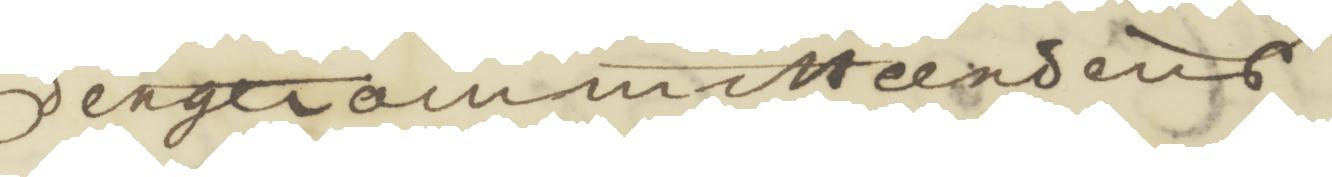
dergecommitteerdens
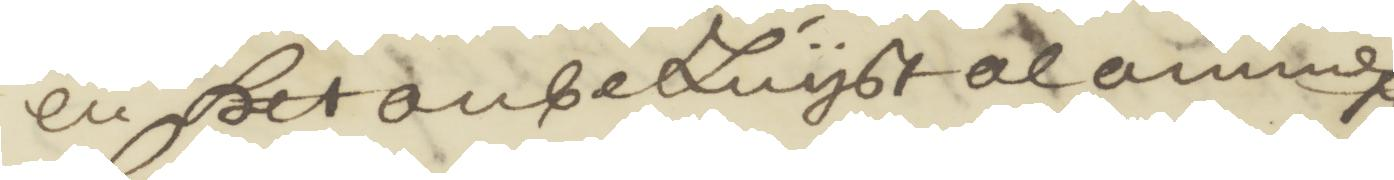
en het onbezuijst al omme
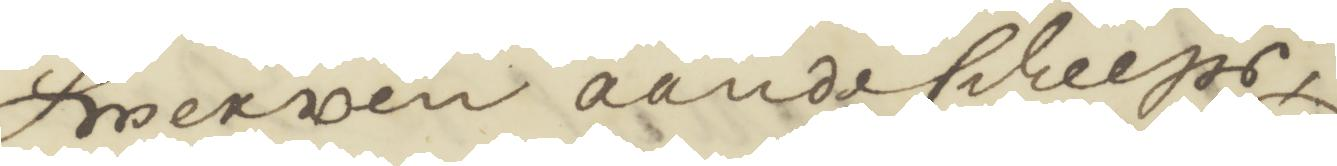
swerven aan de scheeps,
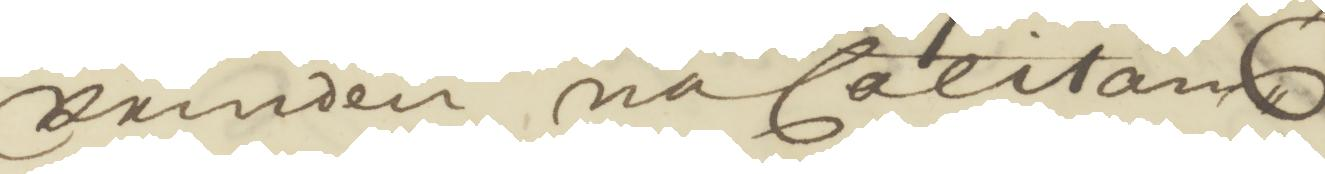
vrinden na Calitan„
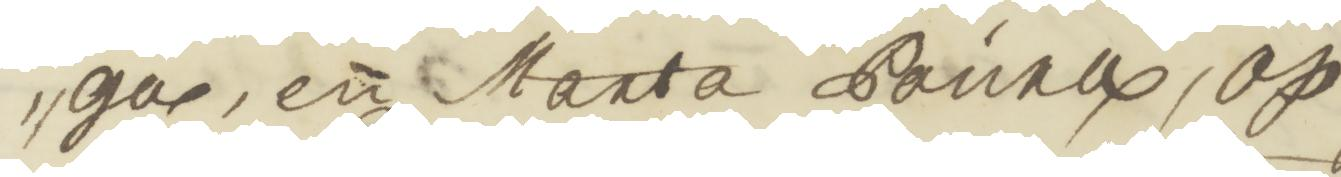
„ga, en Marta Poura, op
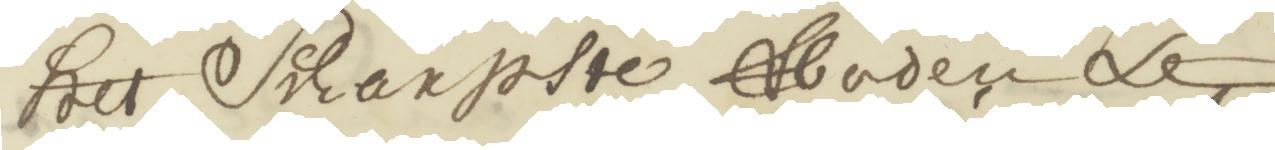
het scharpste verboden te
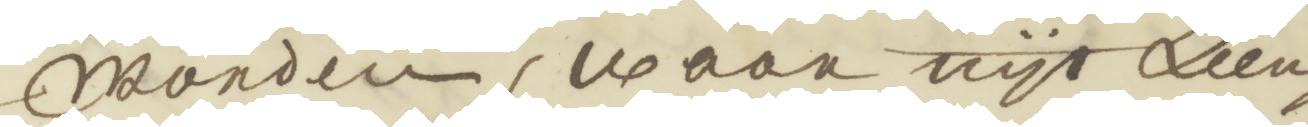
worden, waar uijt zeer
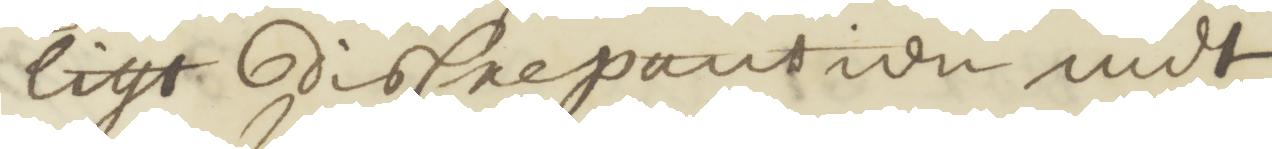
ligt discrepantien met
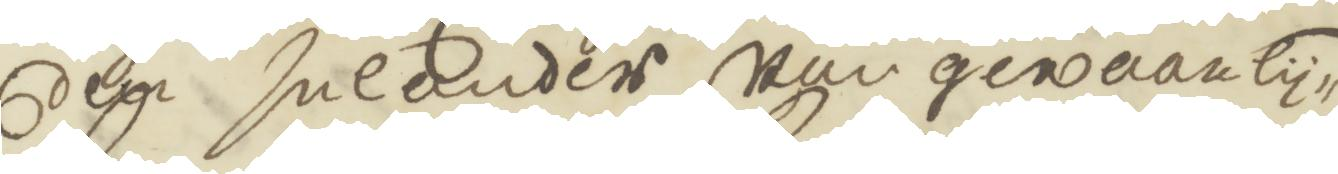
den Jnlander ven gevaarlij„
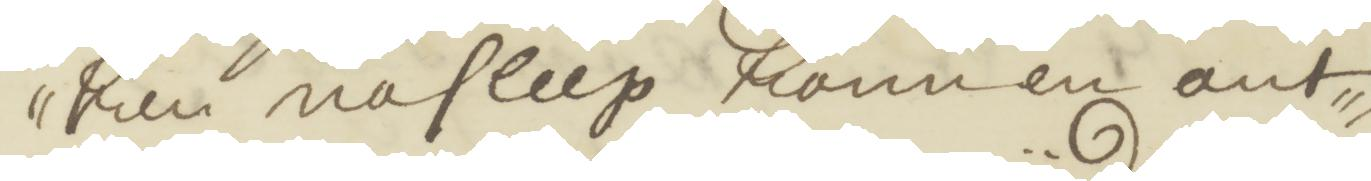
„ken nasleep konnen ont„
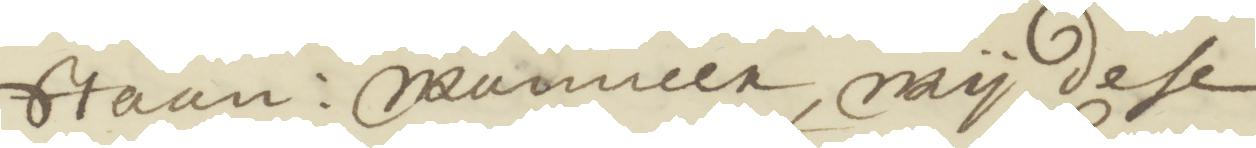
staan: wanneer, wij dese
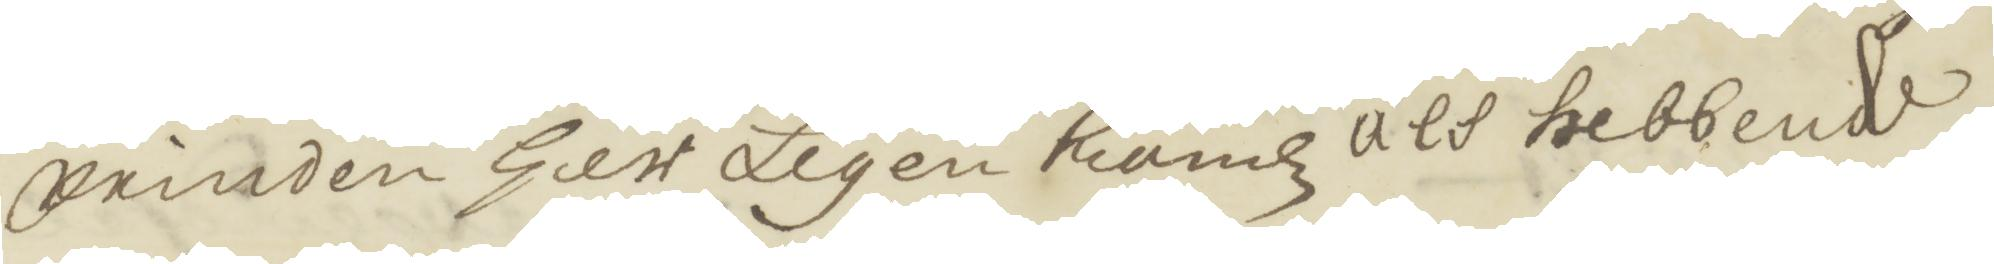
vrinden hier tegen komen als hebbende
